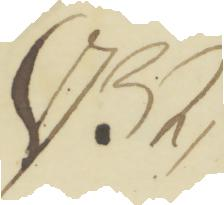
1732,
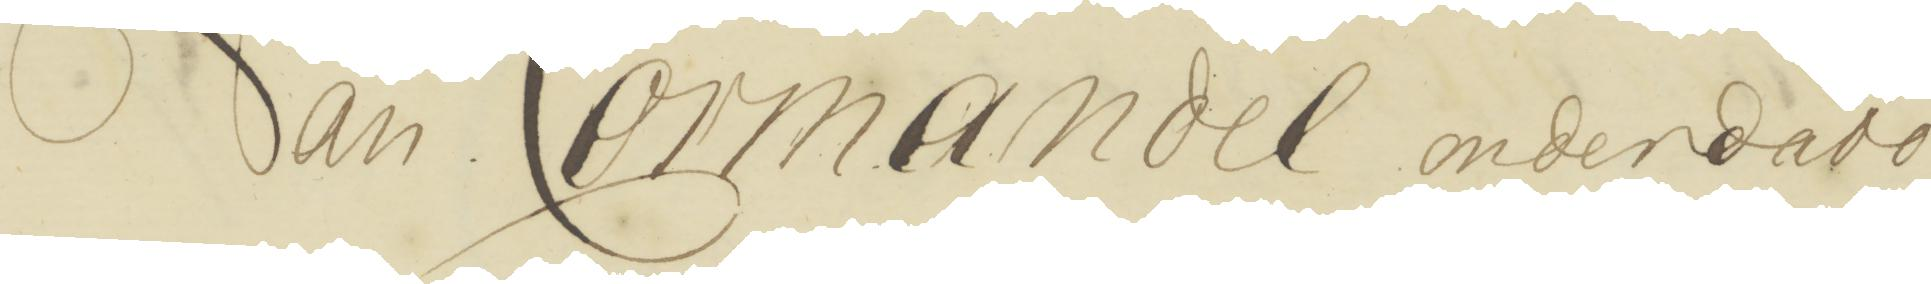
Van Cormandel onder dato
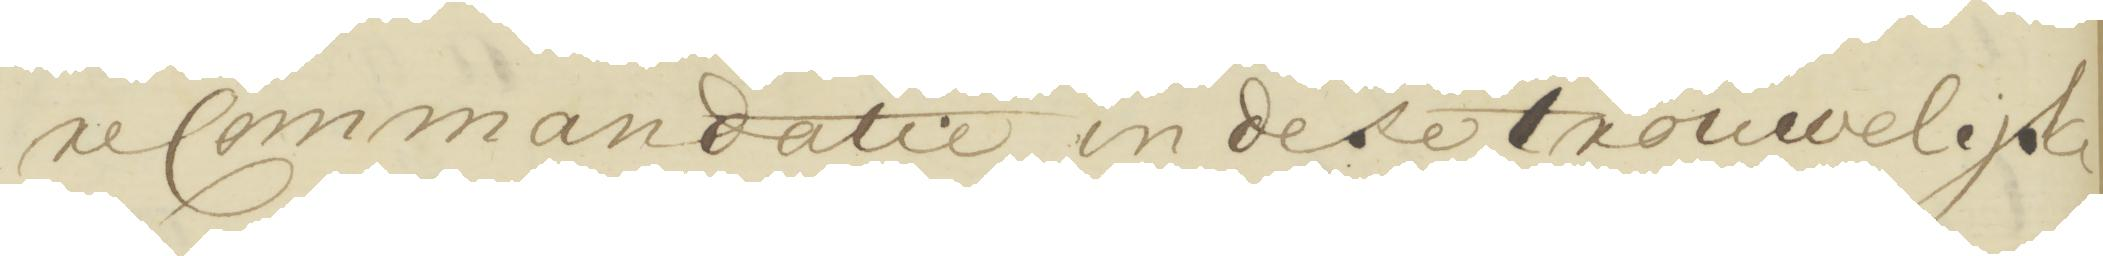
recommandatie in dese trouwelijke
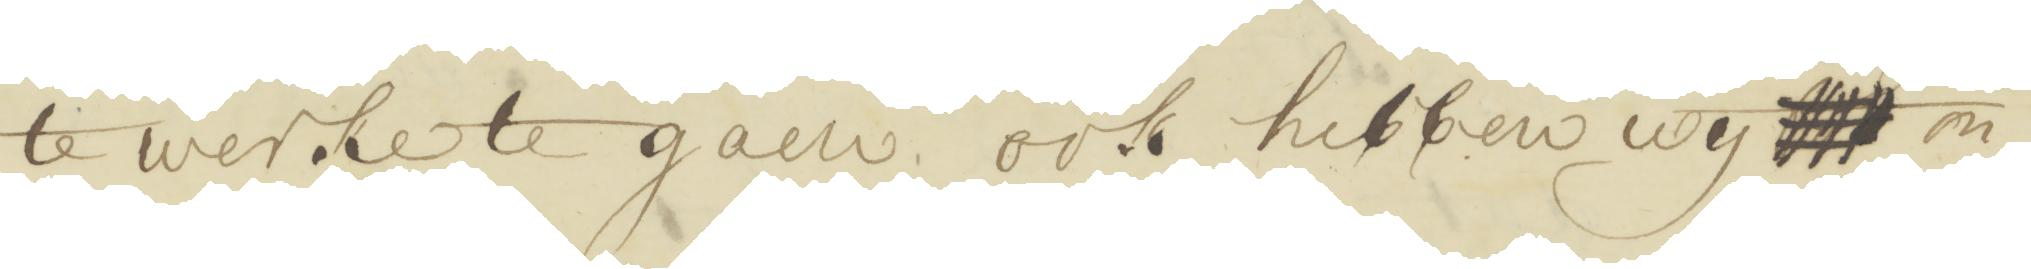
te werke te gaen ook hebben wy ffff on
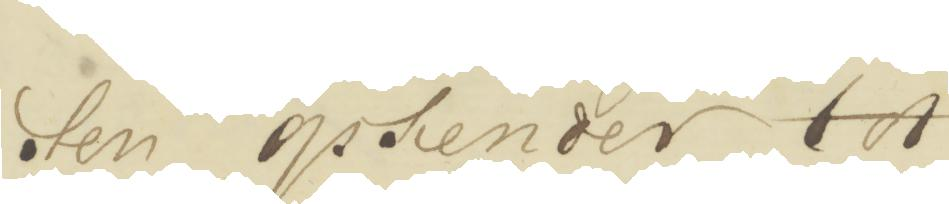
sen opsiender tot
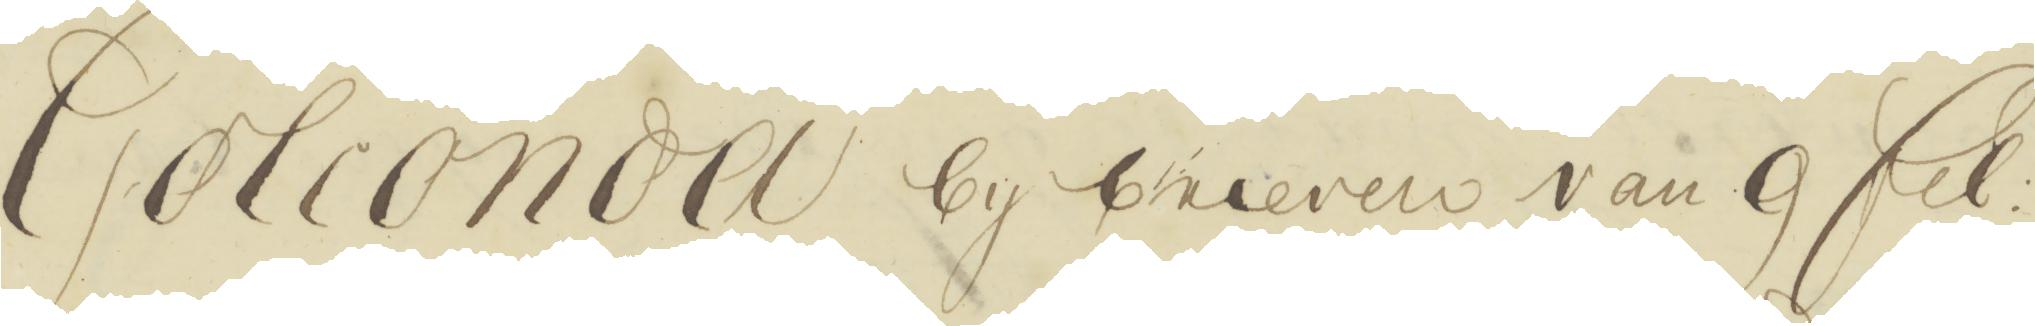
Golconda bij brieven van 9 feb:
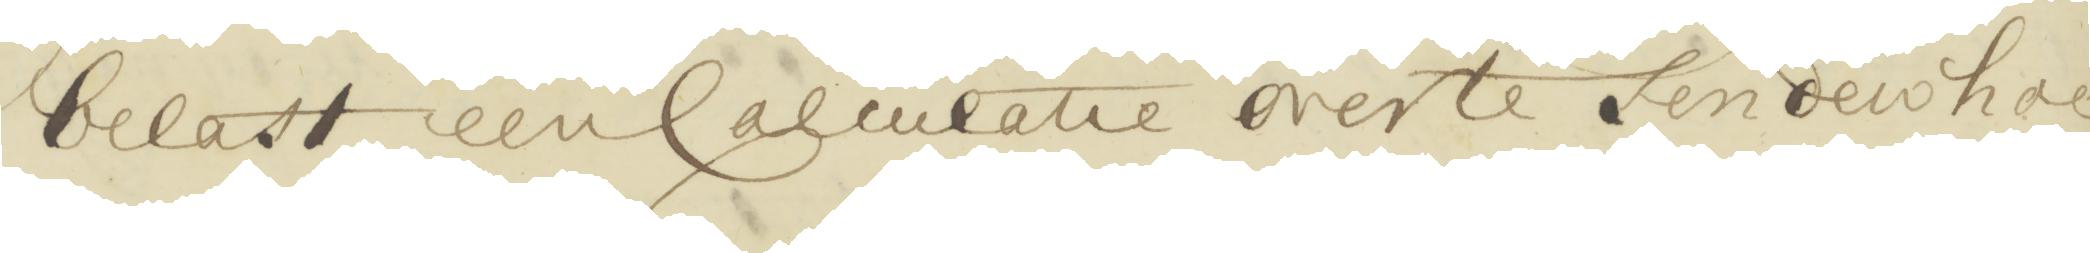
belast een calculatie over te senden heo
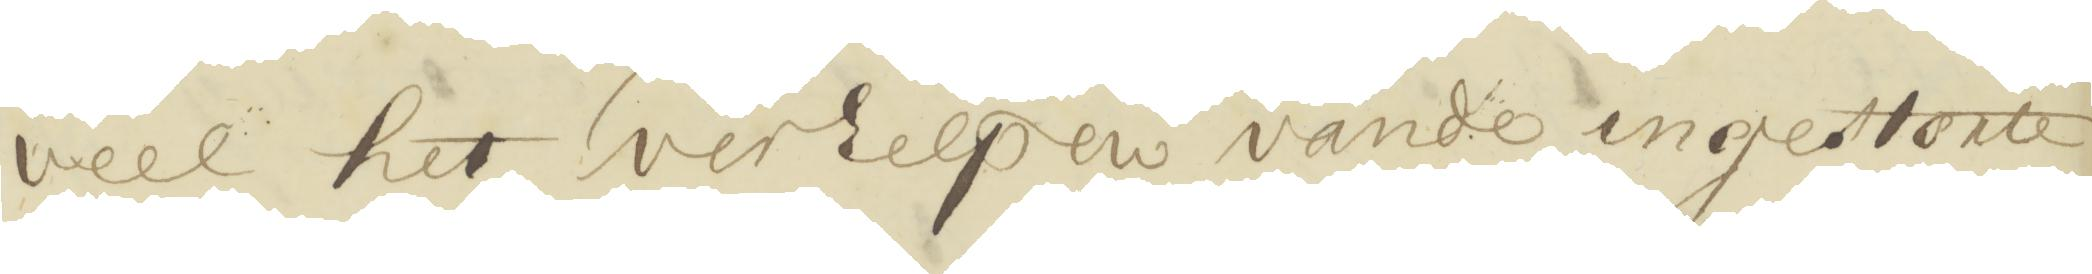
veel het verhelpen vande ingestorte
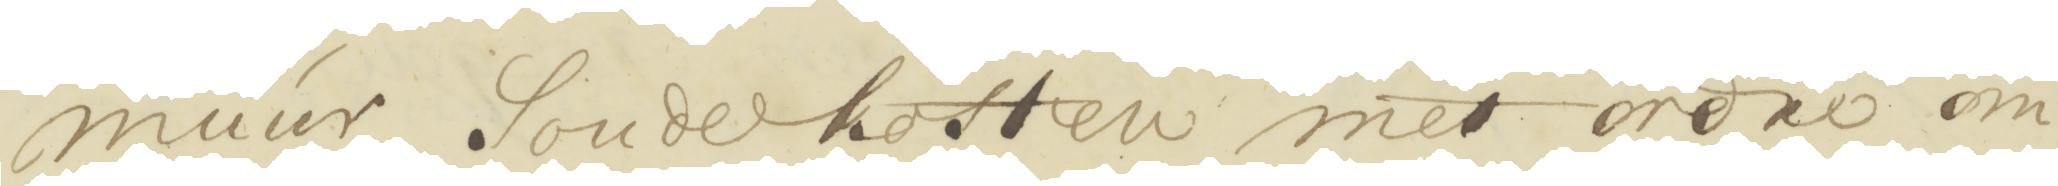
muur soude kosten met ordre om
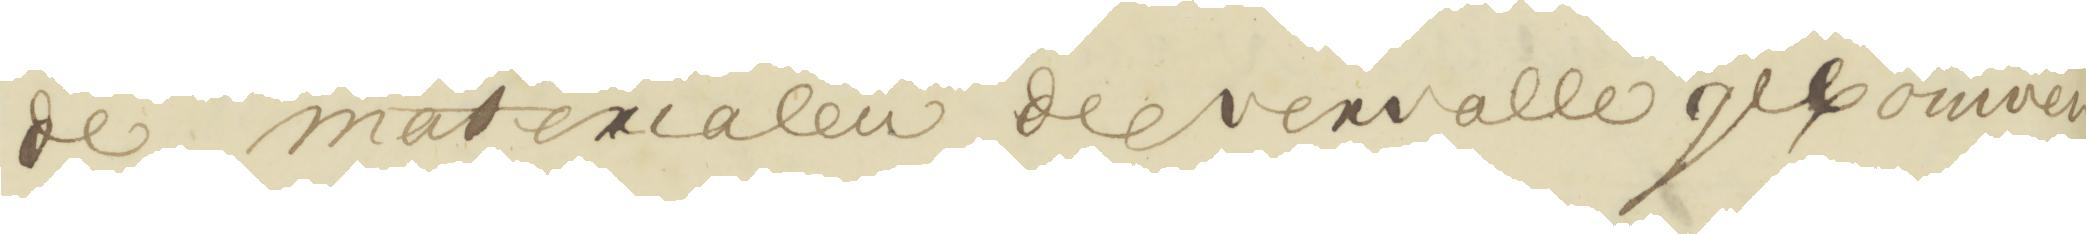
de materialen der vervalle gebouwen
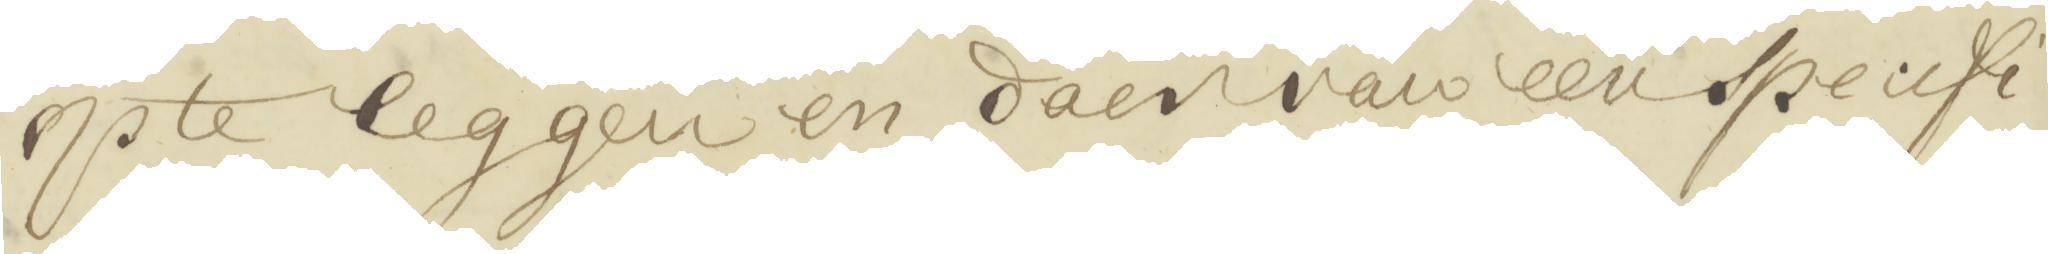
op te leggen en daervan een specifi
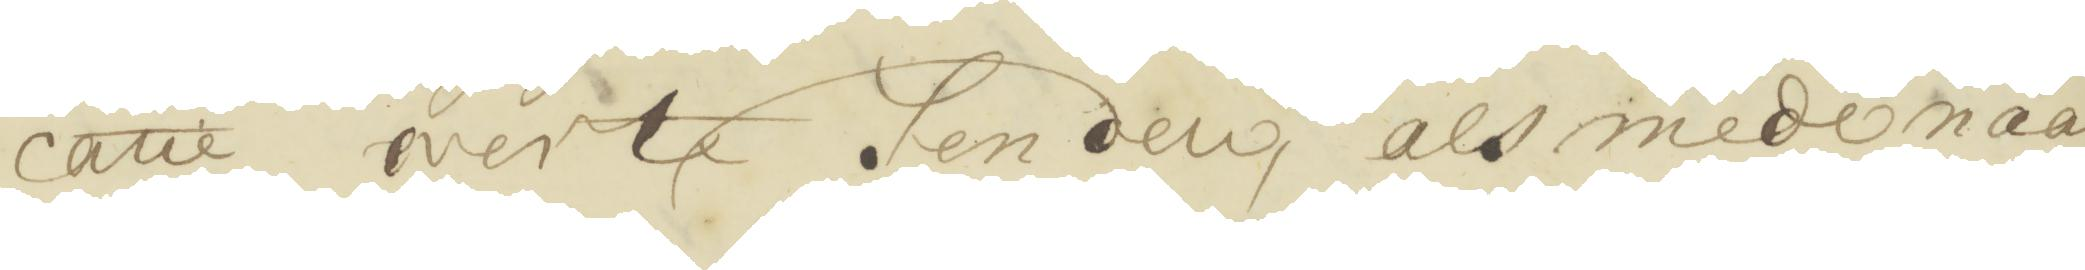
catie overte senden, als mede naar
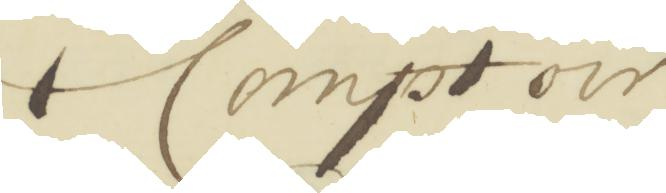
tComptoir
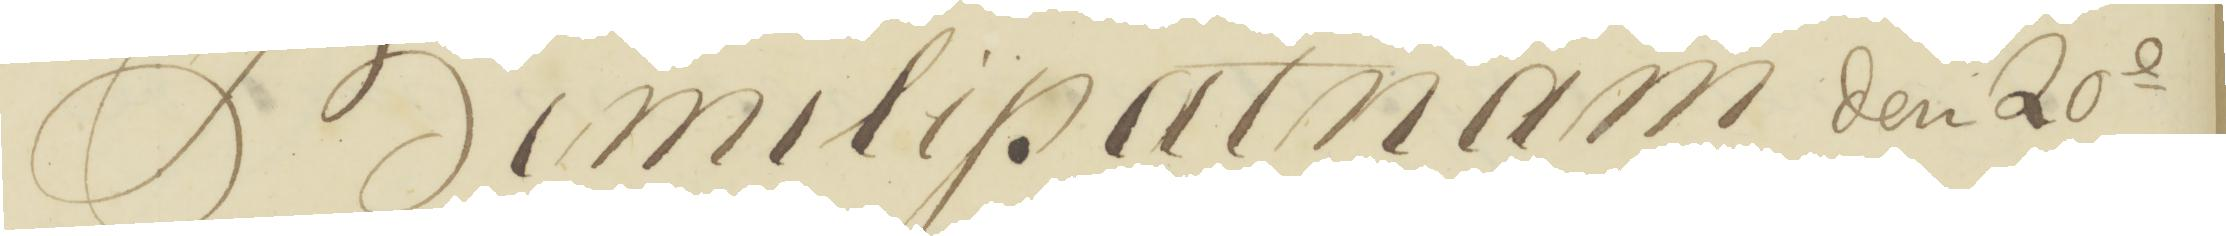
Bimilipatnam den 20-e
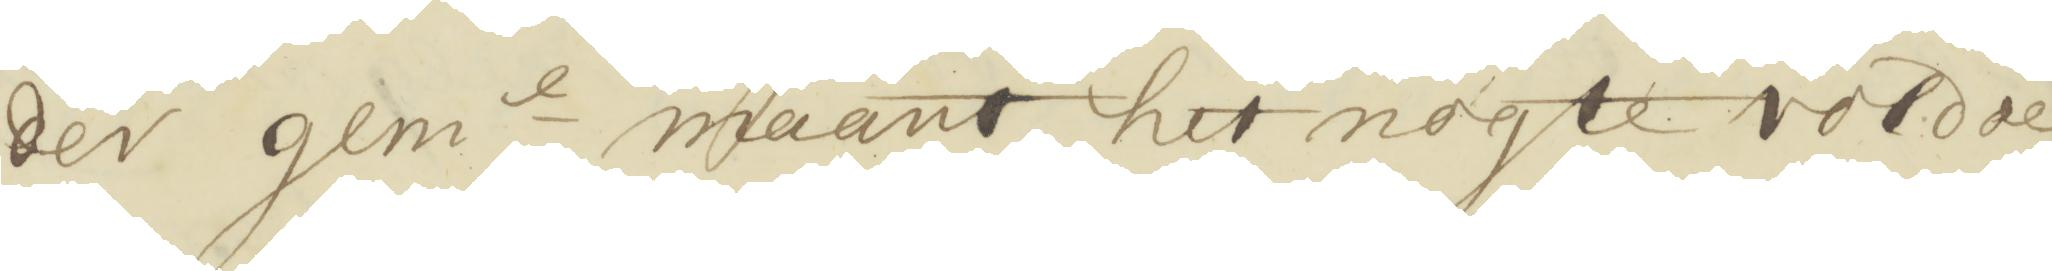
der gem -e maant het nogte voldoe
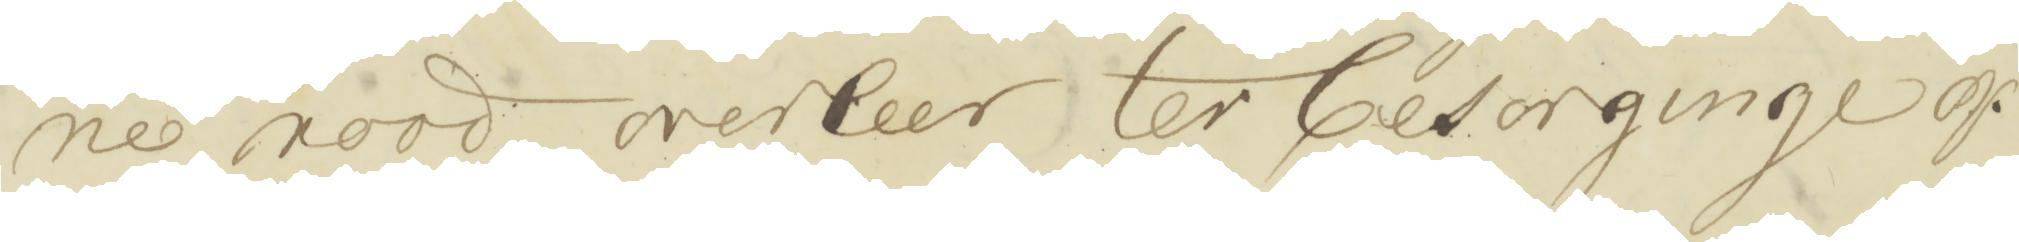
ne rood overleer ter besorginge op
